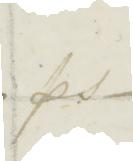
p.s
